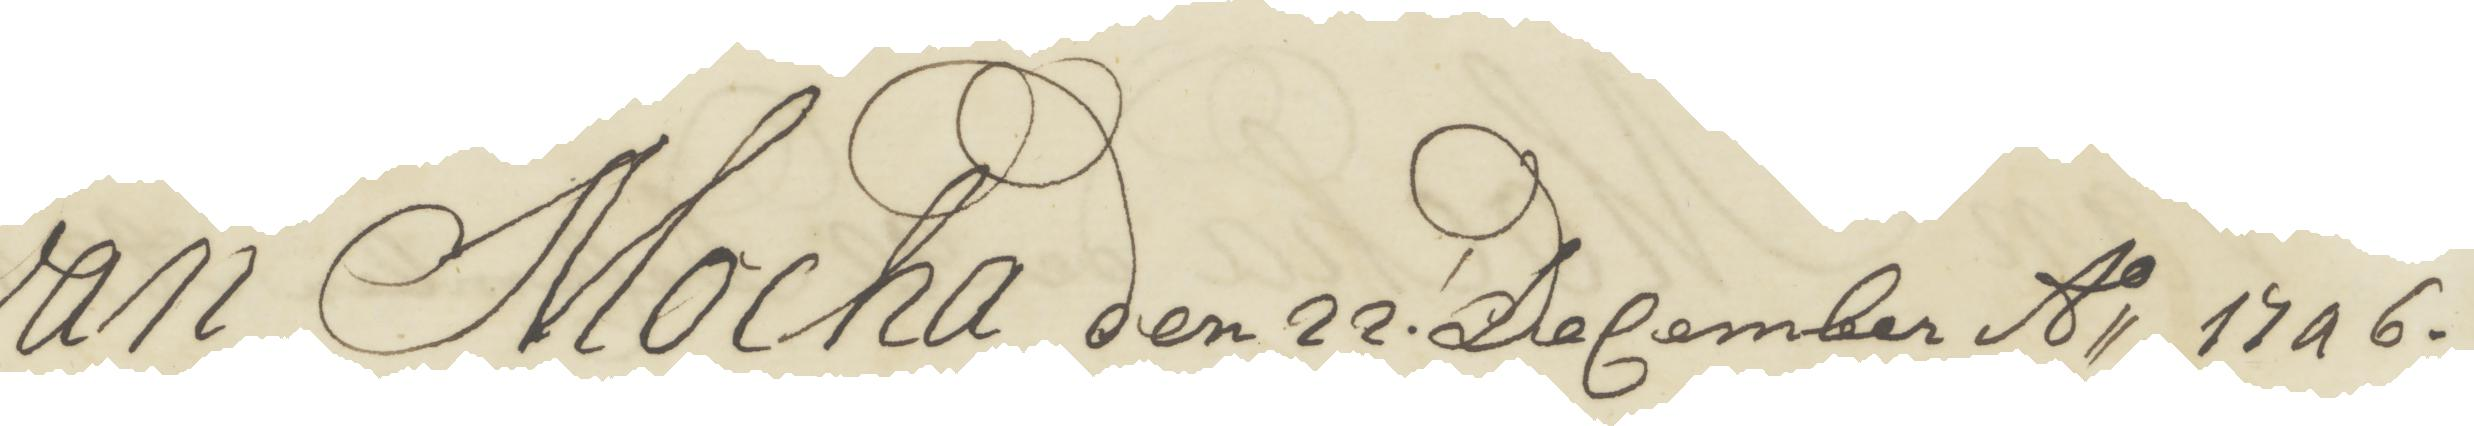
an Mocha den 22.' December A„o 1746.
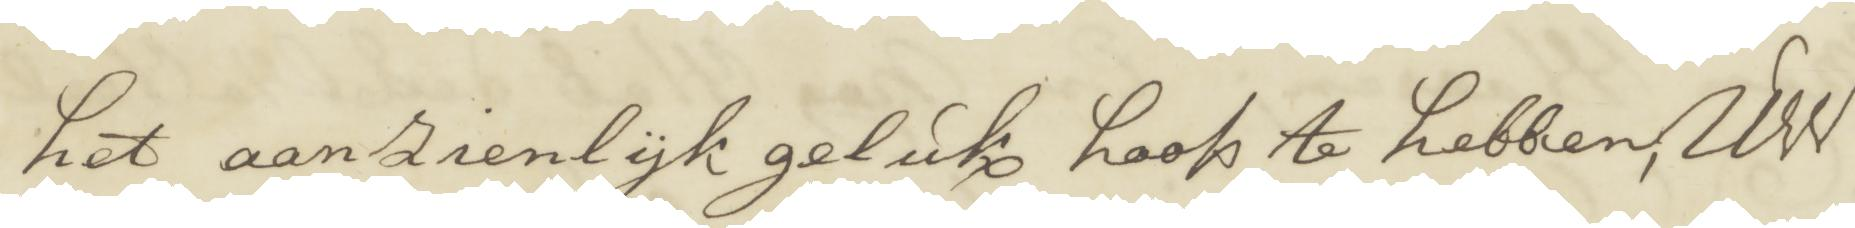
het aanzienlijk geluk hoop te hebben, UW
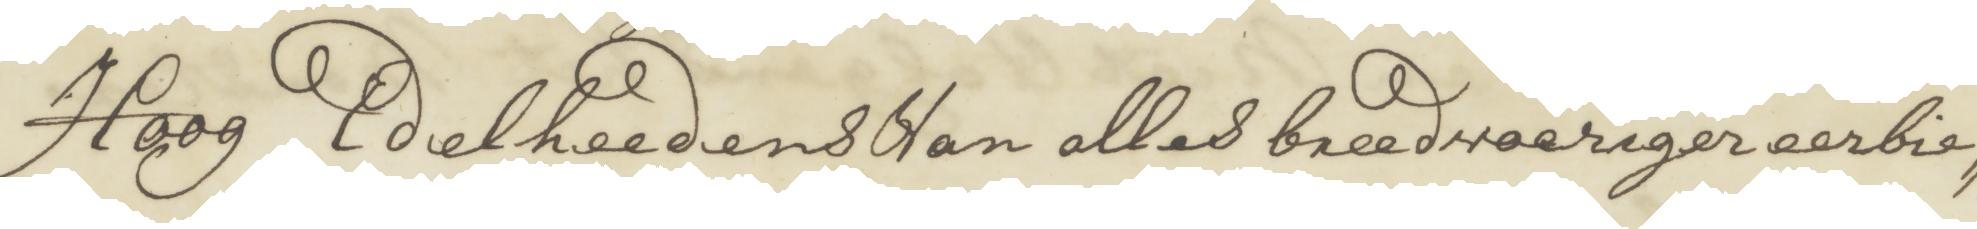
Hoog Edelheedens Van alles breedvoeriger eerbie
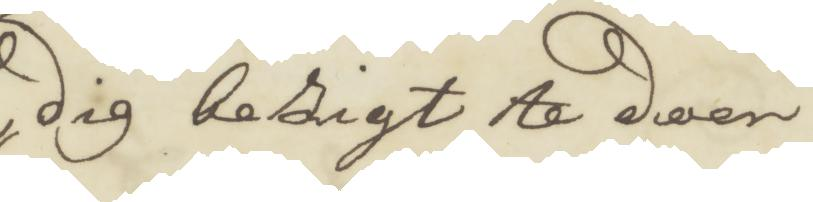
dig bezigt te doen
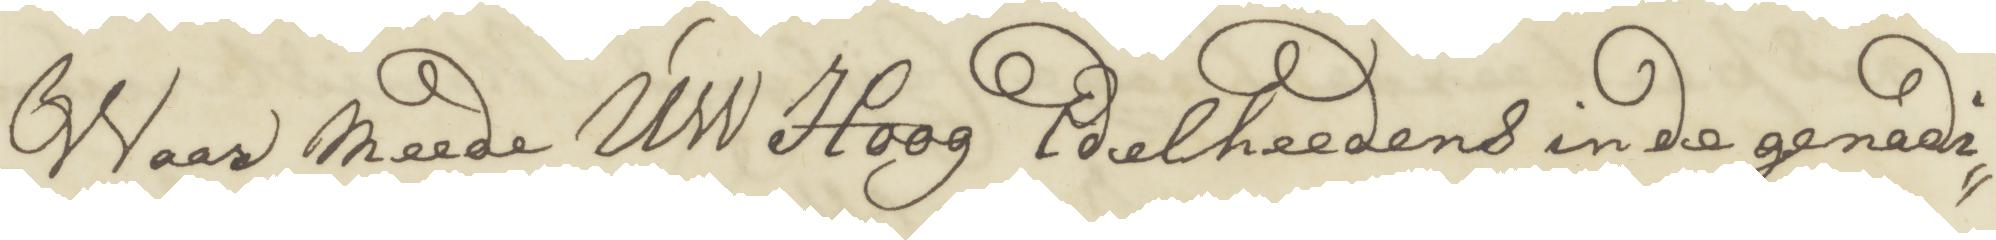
Waar Meede UW Hoog Edelheedens in de genadi„
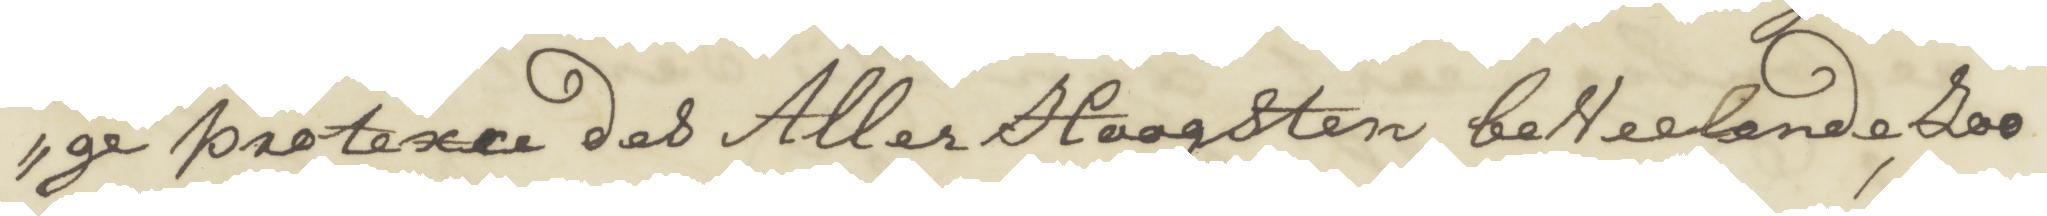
„ge protexce des Aller Hoogsten beveelende, zoo
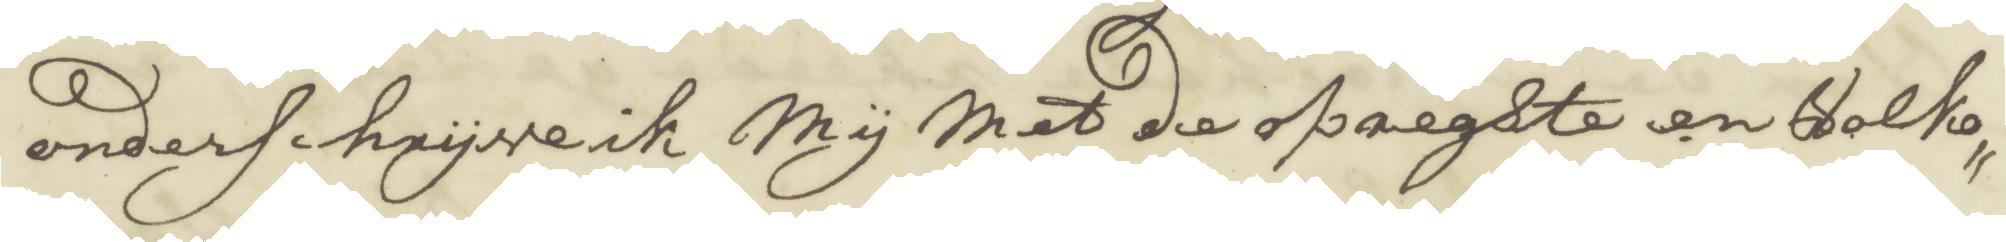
onderschrijve ik mij met de opregste en volko„
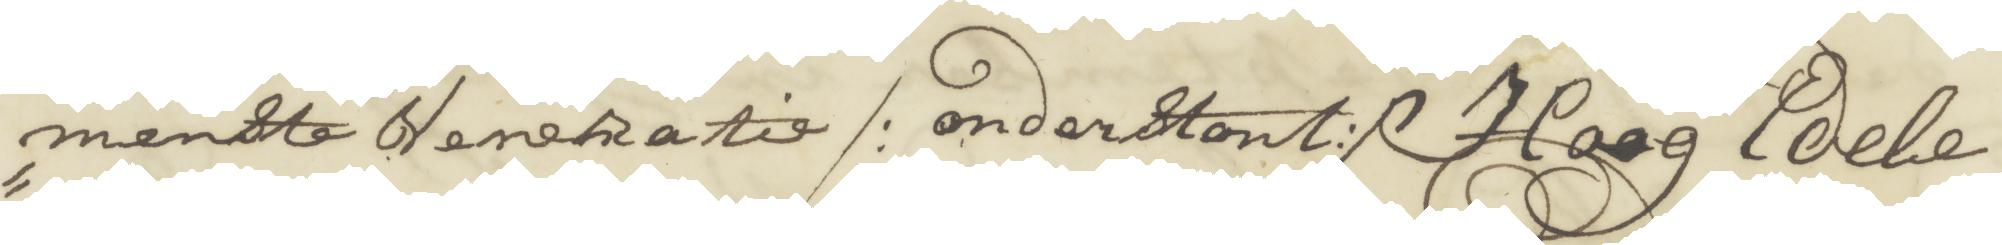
„menste Veneratie /: onderstont :/ Hoog Edele
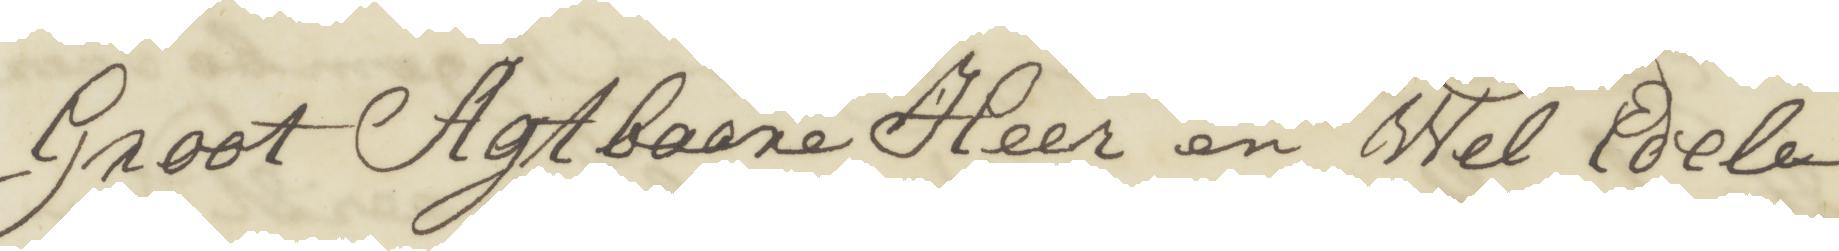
Groot Agtbaare Heer en Wel Edele
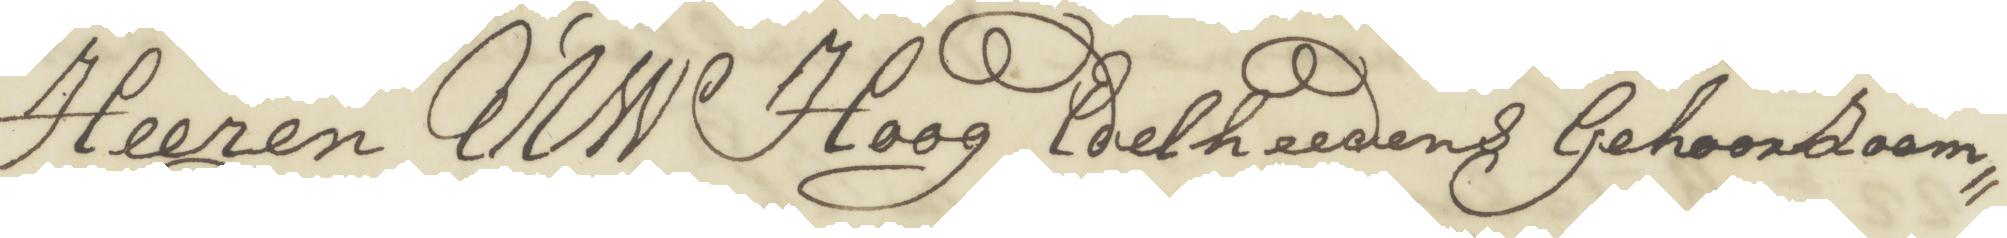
Heeren UW Hoog Edelheedens Gehoorzaam„
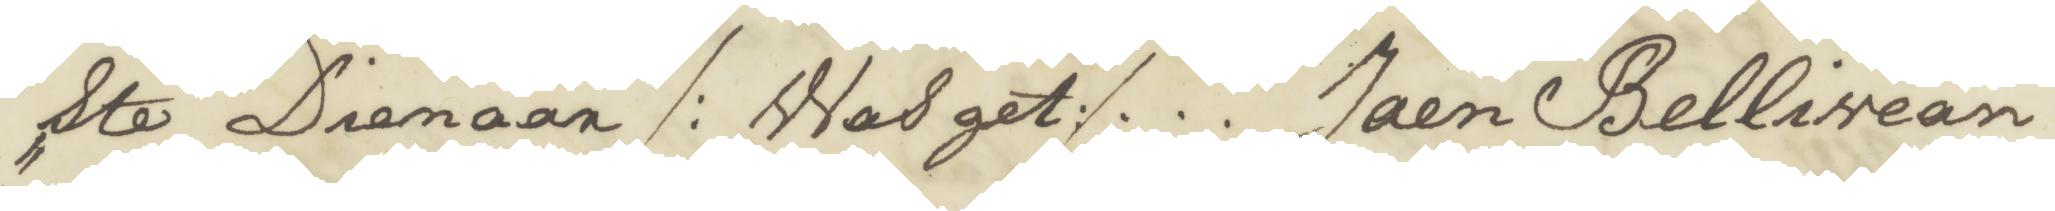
„ste Dienaar /: Was get :/ ... Jaen Bellivean
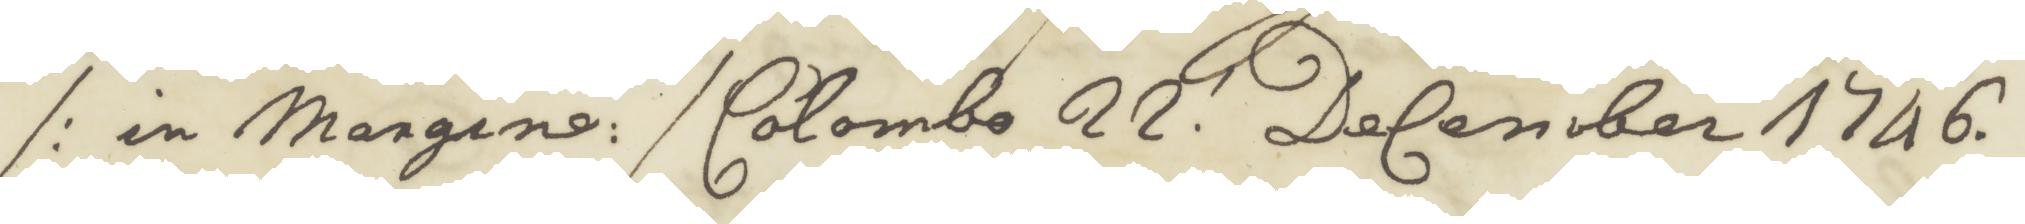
/: in Margine :/ Colombo 22:' December 1746.
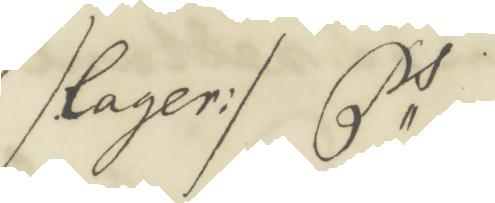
/: lager :/ P„s
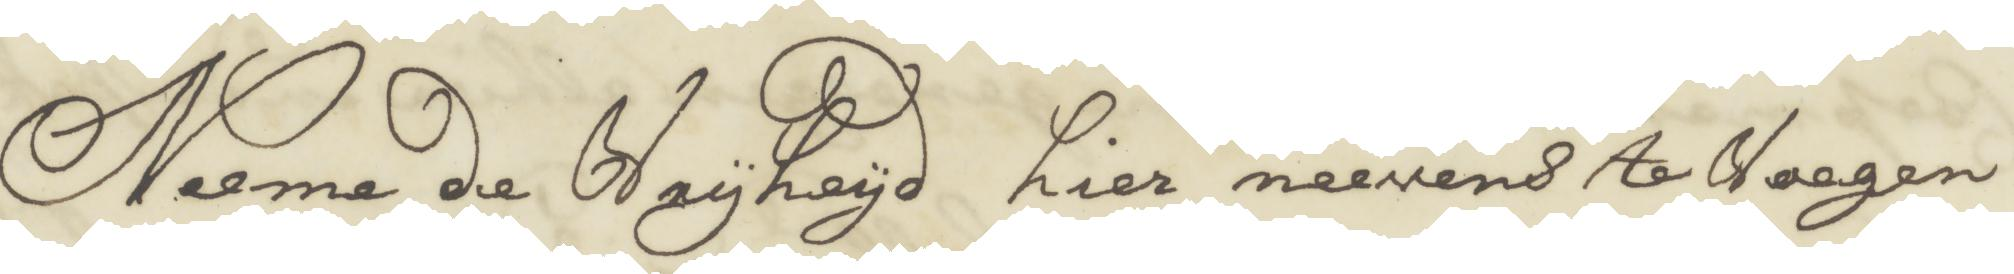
Neeme de Vrijheijd hier neevens te Voegen
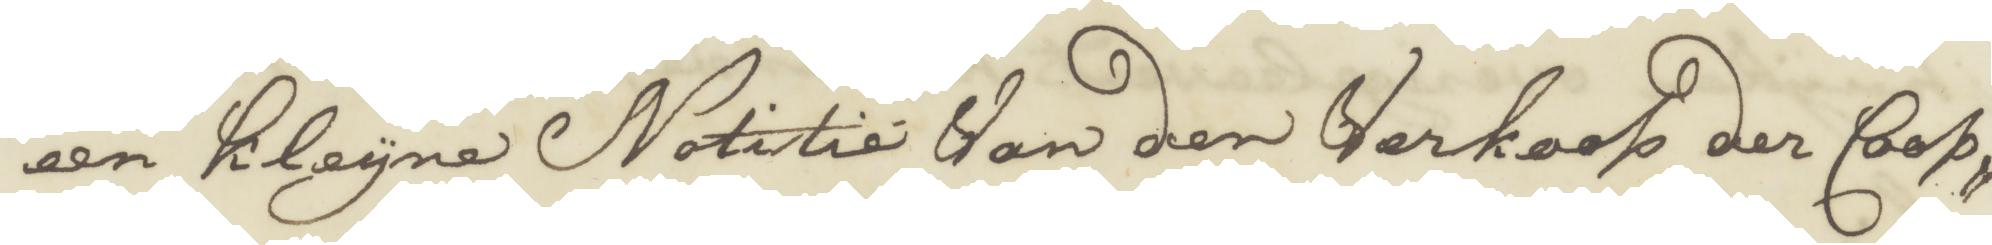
een kleijne Notitie van den Verkoop der Coop„
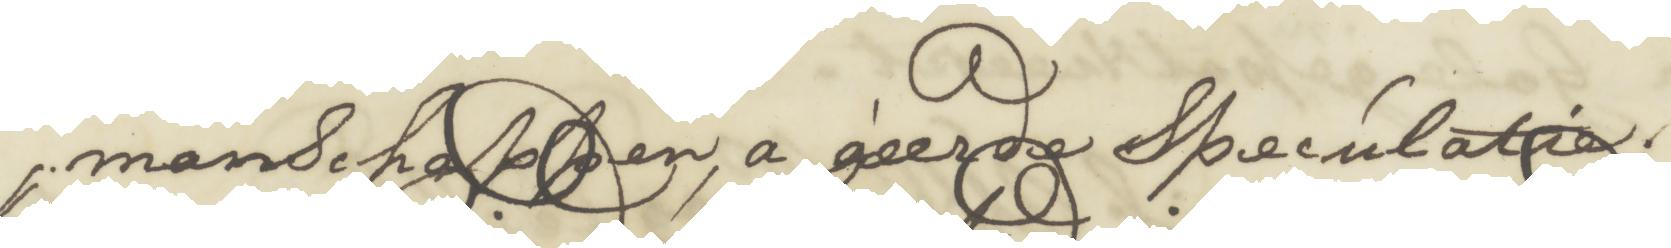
„manschappen, a g'eerde speculatie;
